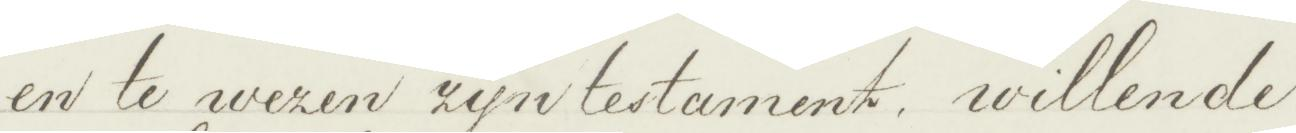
en te wezen zijn testament, willende
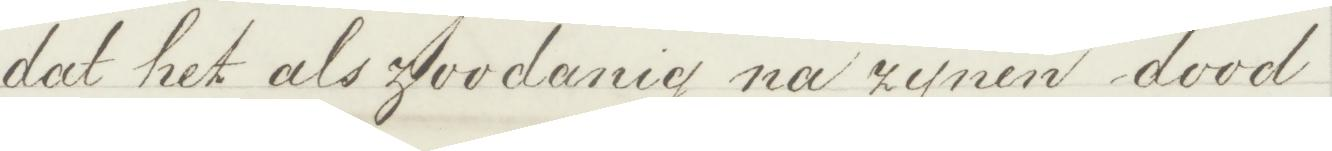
dat het als zoodanig na zijnen dood
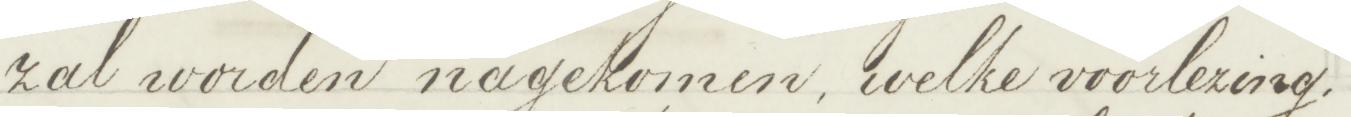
zal worden nagekomen, welke voorlezing,
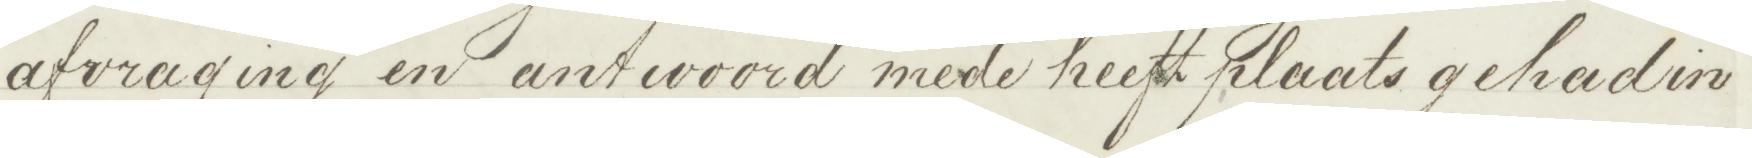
afvraging en antwoord mede heeft plaats gehad in
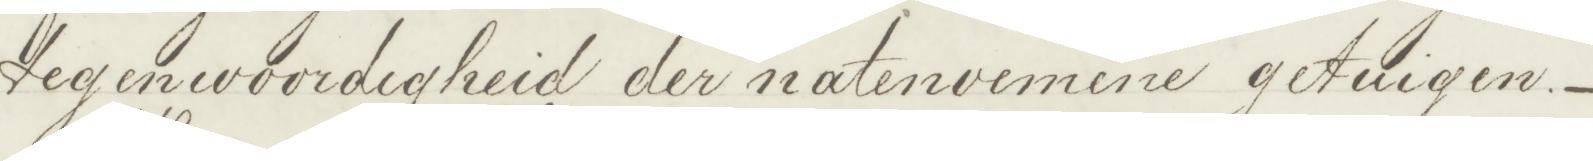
tegenwoordigheid der natenoemene getuigen.
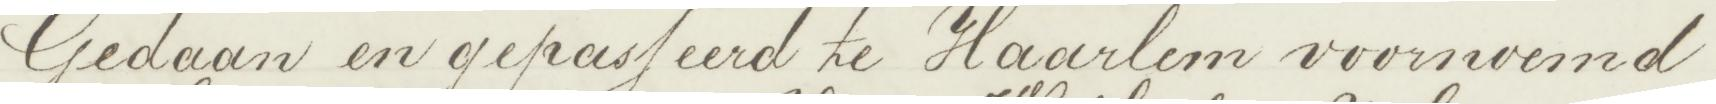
Gedaan en gepasseerd te Haarlem voornoemd
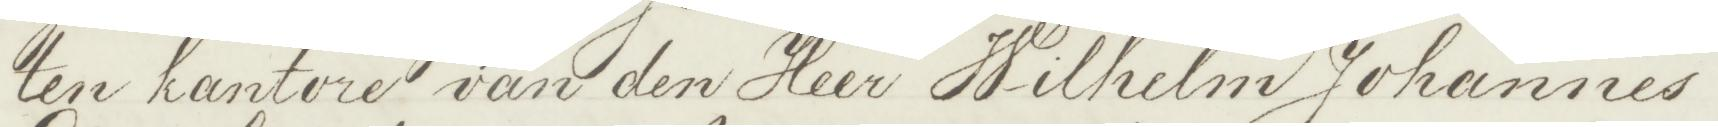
ten kantore van den Heer Wilhelm Johannes
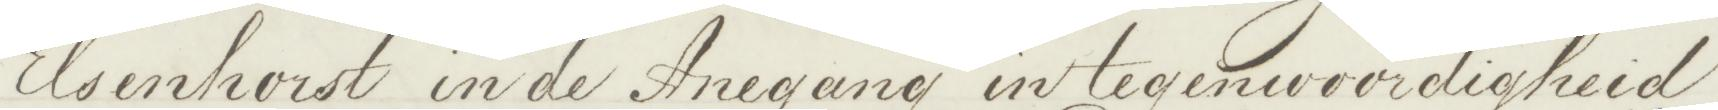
Elsenhorst in de Anegang in tegenwoordigheid
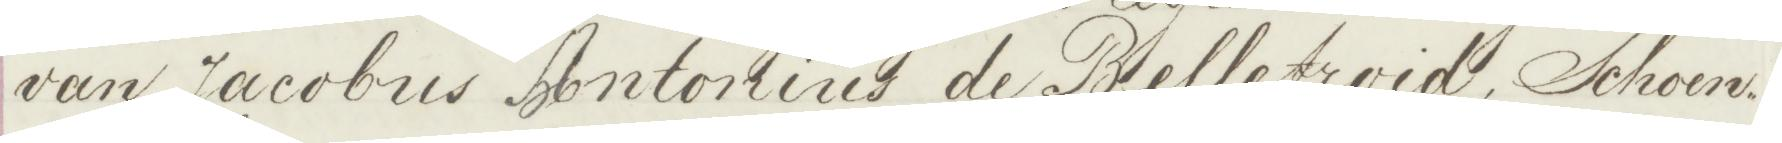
van Jacobus Antonius de Bellefroid, Schoen„
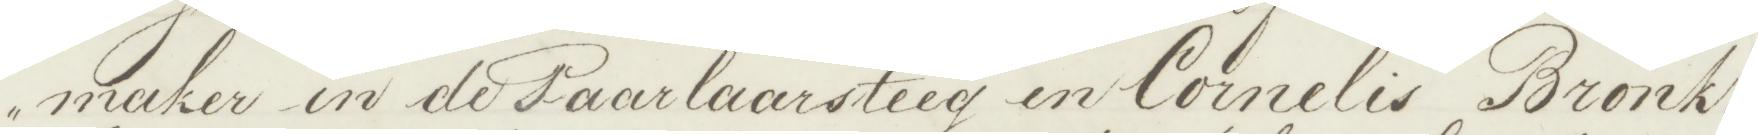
„maker in de Paarlaarsteeg en Cornelis Bronk
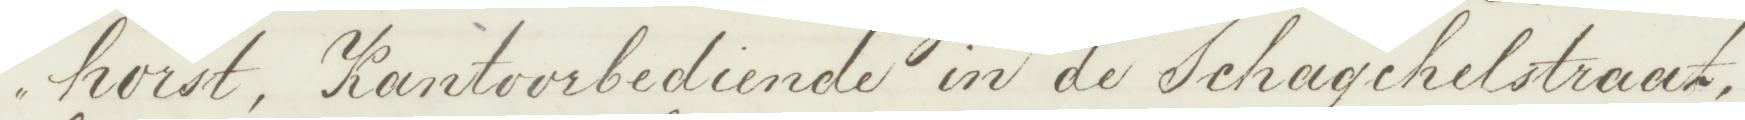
„horst, Kantoorbediende in de Schagchelstraat,
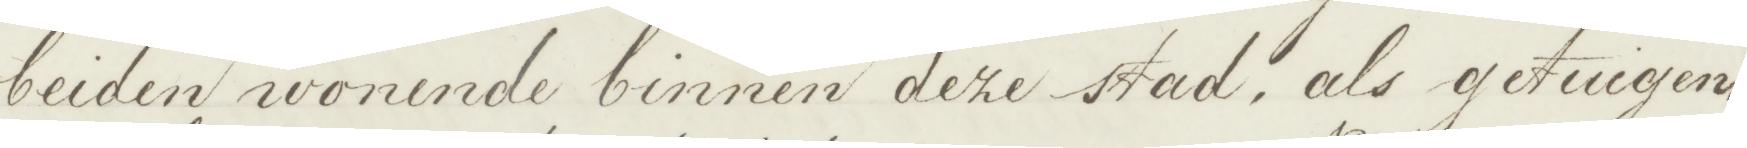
beiden wonende binnen deze stad, als getuigen,
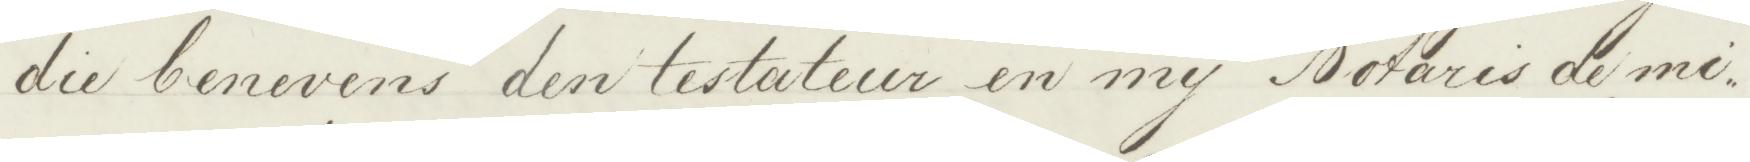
die benevens den testateur en mij Notaris de mi„
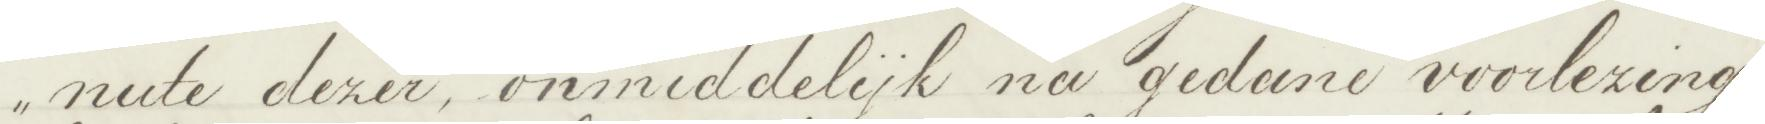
„nute dezer, onmiddelijk na gedane voorlezing
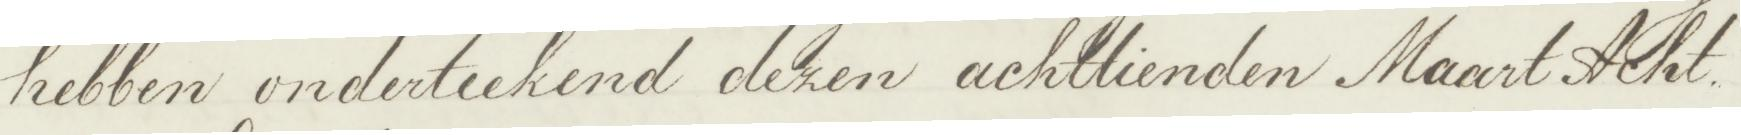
hebben onderteekend dezen achttienden Maart Acht„
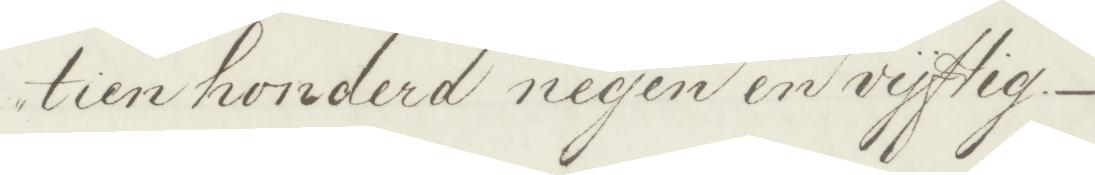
„tien honderd negen en vijftig.
